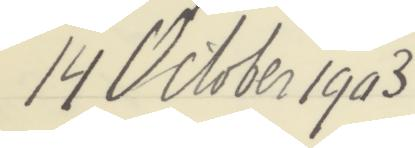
14 October 1903
